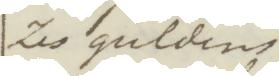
zes guldens
